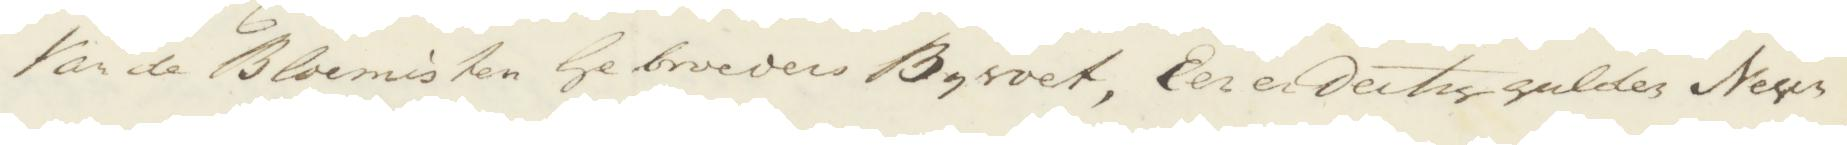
Van de Bloemisten Gebroeders Byvoet, Een en dertig gulden Negen
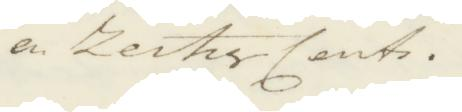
en Zestig Cents.
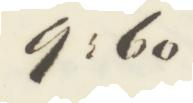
9: 60
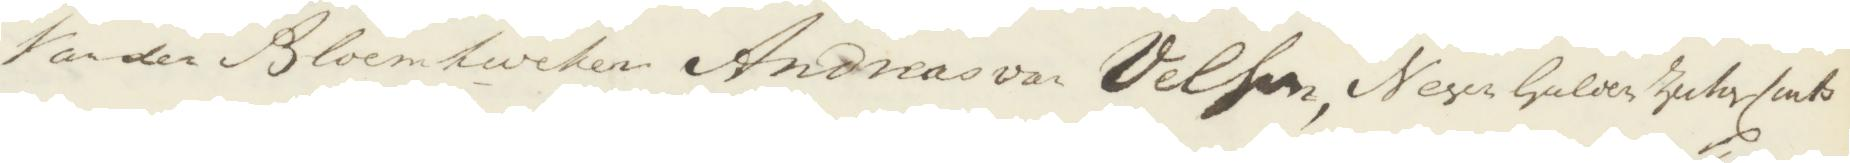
Van der Bloemkweker Andreas van Velsen, Negen Gulden Zestig Cents
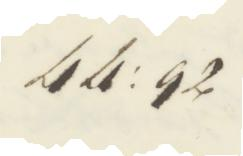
44.92
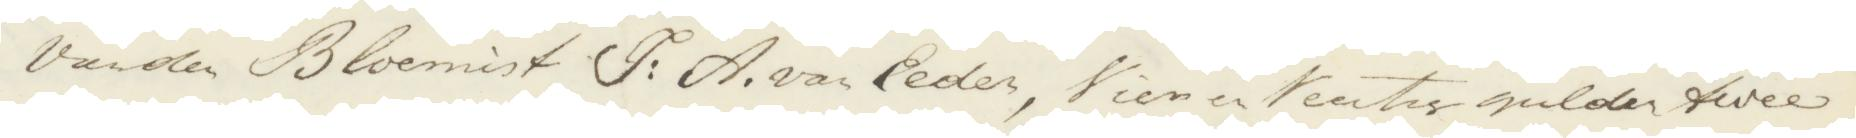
van den Bloemist I: A. van Eeden, Vier en Veertig gulden twee
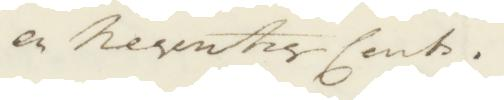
en negentig Cents.
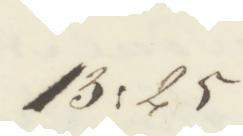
13:25
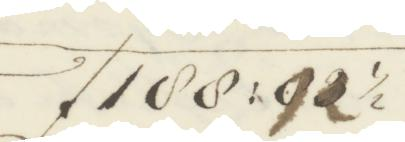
ƒ188:92½
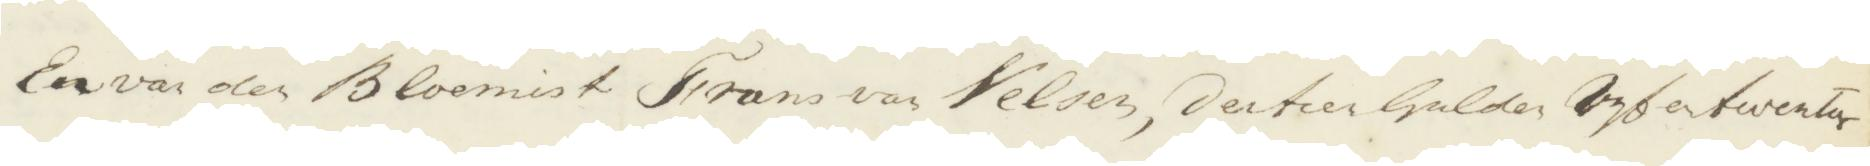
En van den Bloemist Frans van Velsen, dertien Gulden vyf en twintig
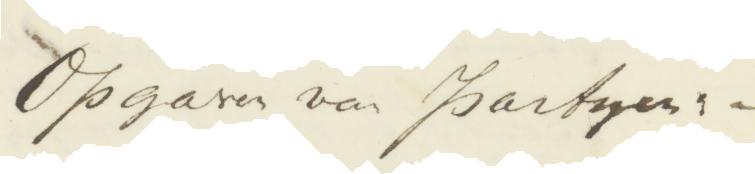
Opgaven van Partyen: -
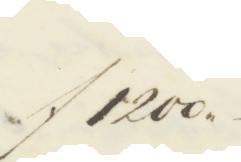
ƒ 1200„
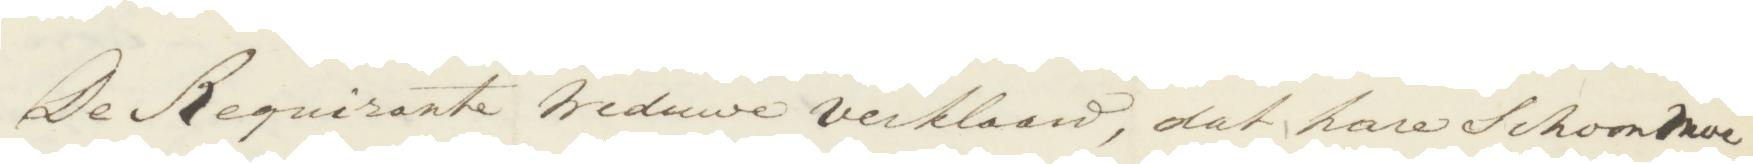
De Requirante weduwe verklaard, dat hare schoonmoe
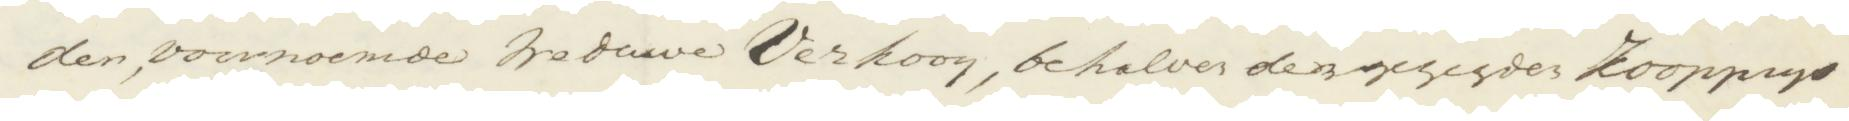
der, voornoemde weduwe Verhoog, behalven den gezegden Koopprys
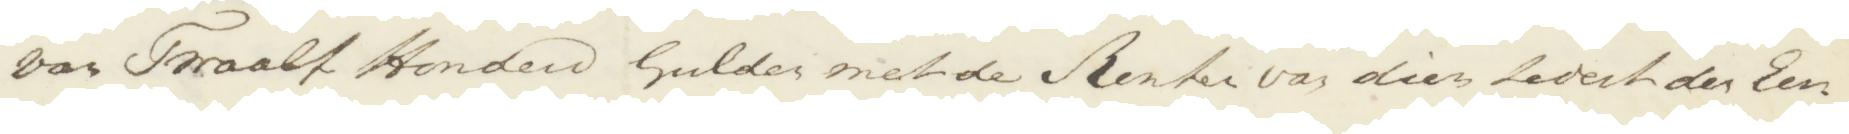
van Twaalf Honderd Gulden met de Renten van dien zedert den Eer
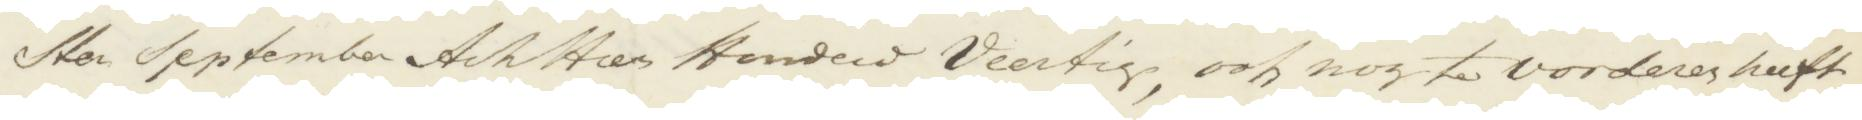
sten september Achttien Honderd Veertig, ook nog te vorderen heeft
